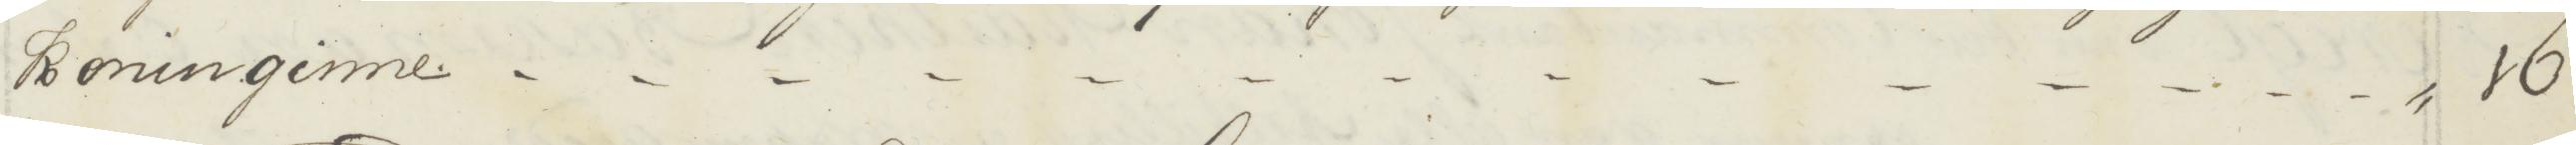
Koninginne - - - - - - - - - - - - - - - „ 16
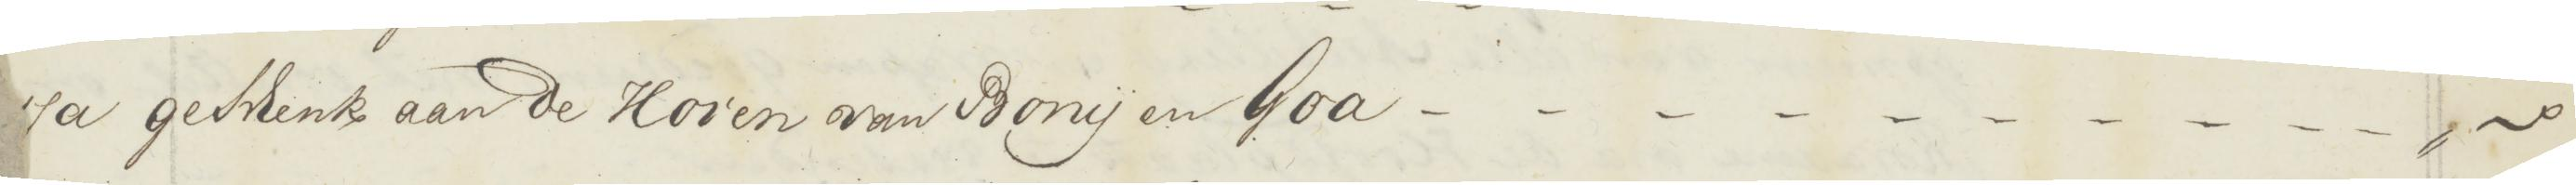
sa geschenk aan de Hoven van Bonij en Goa - - - - - - - - - - „ _o
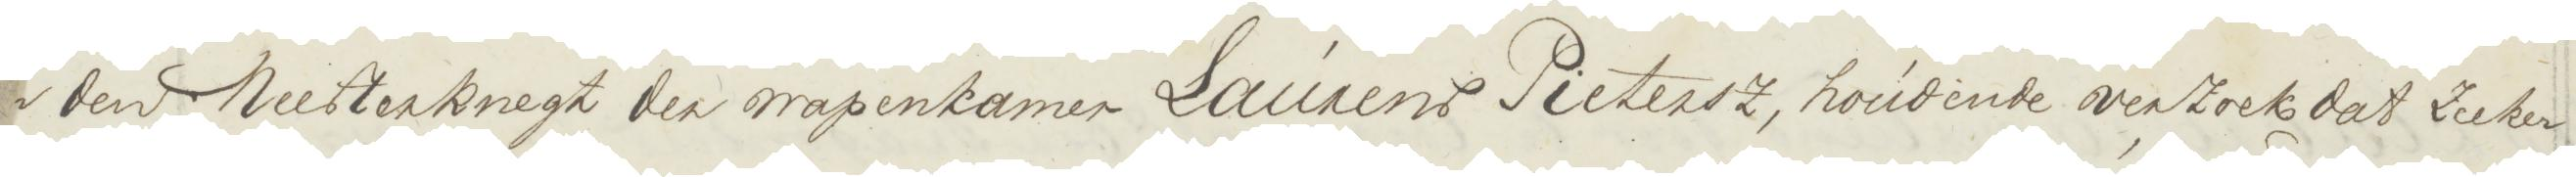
den Meesterknegt der wapenkamer Laurens Pietersz, houdende verzoek dat zeeker
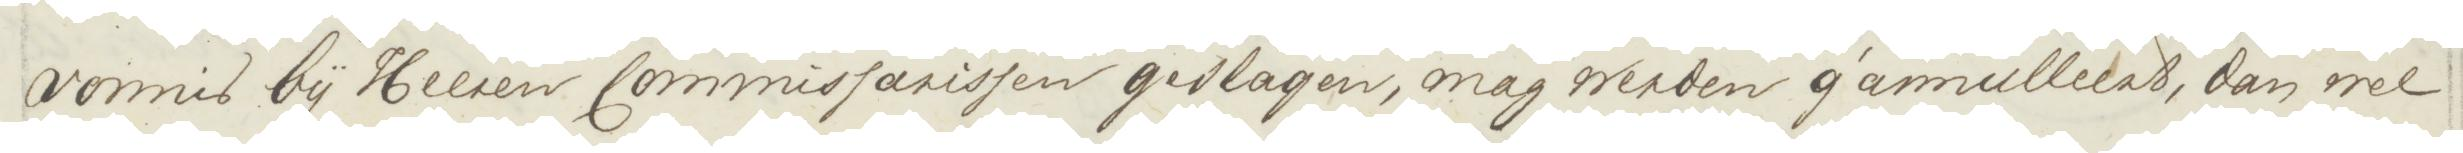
vonnis bij Heeren Commissarissen geslagen, mag werden g’annulleert, dan wel
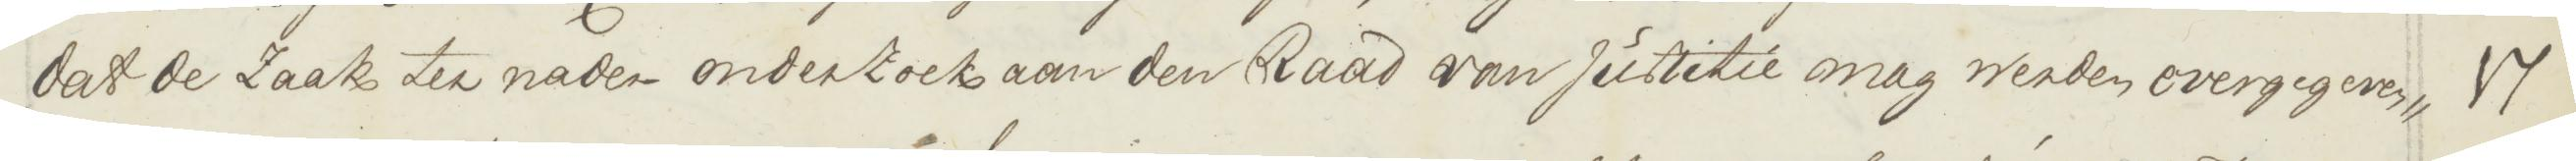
dat de zaak ter nader onderzoek aan den Raad van Justitie mag werden overgegeven„ 17
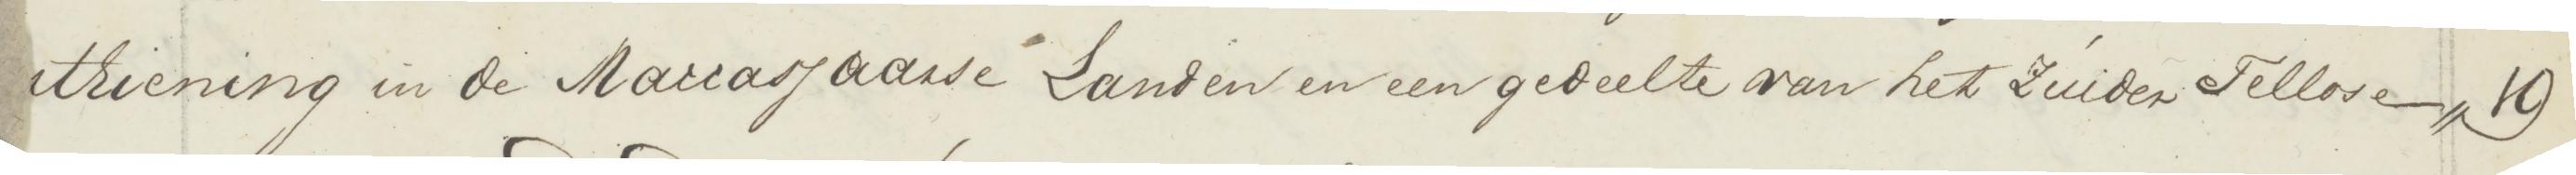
thiening in de Maccassaarse Landen en een gedeelte van het zuider Tellose - „ 19
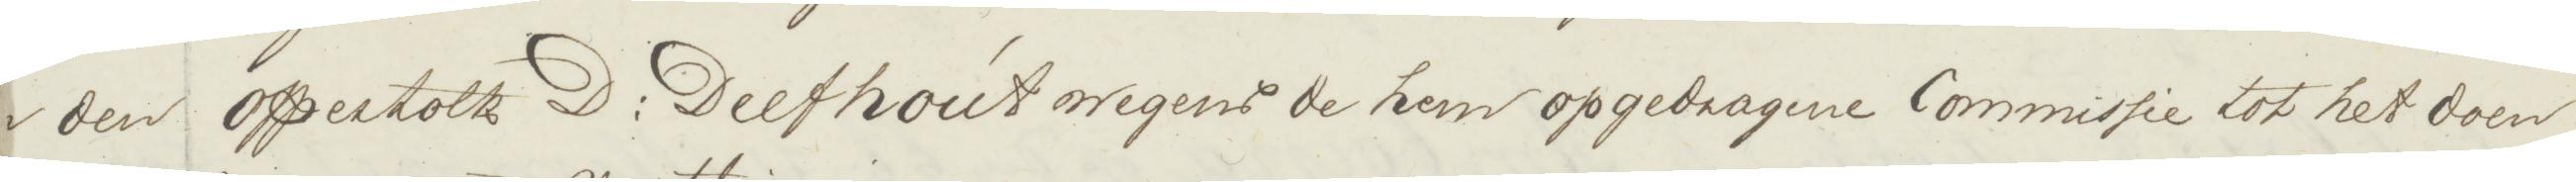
den oppertolk D: Deefhout wegens de hem opgedragene Commissie tot het doen
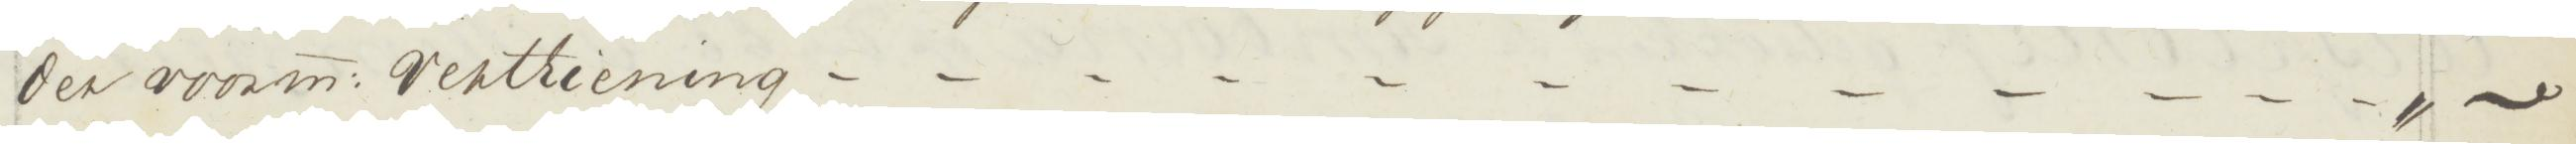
der voorm: verthiening - - - - - - - - - - - - „ _o
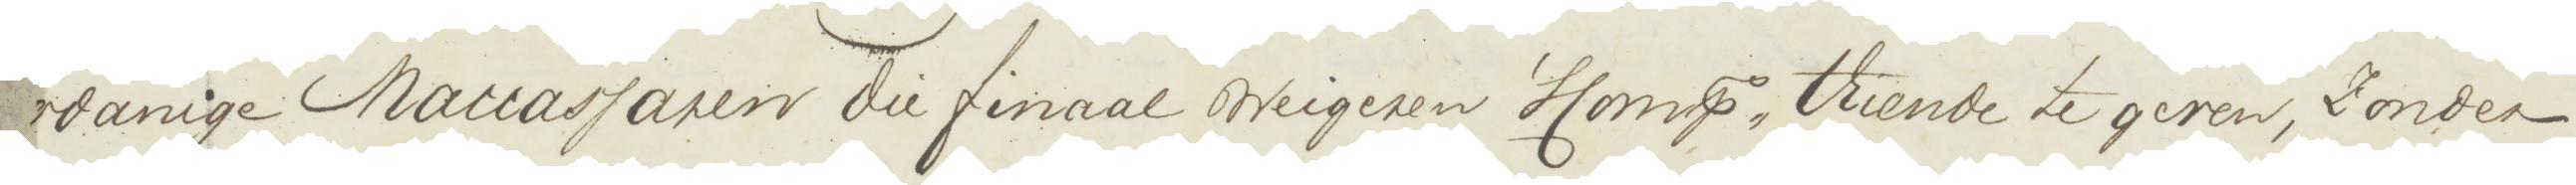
rdanige Maccassaren die finaal weigeren ’sComp„s thiende te geven, zonder
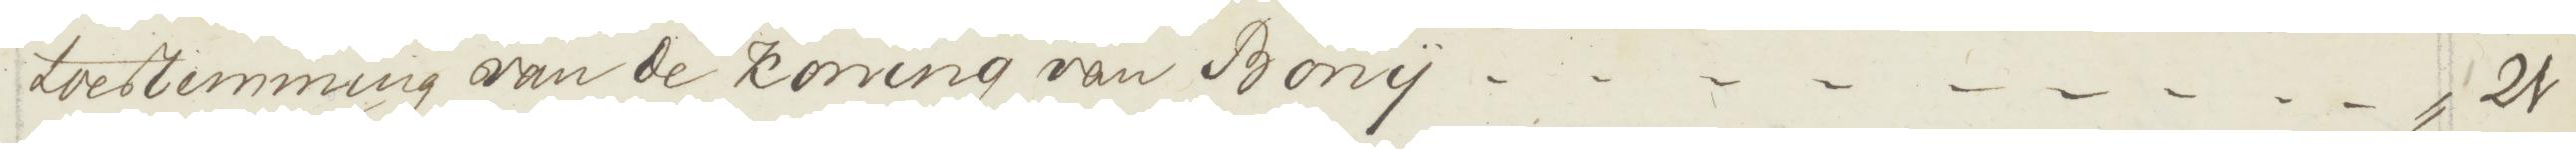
toestemming van de Koning van Bonij - - - - - - - - - „ 21
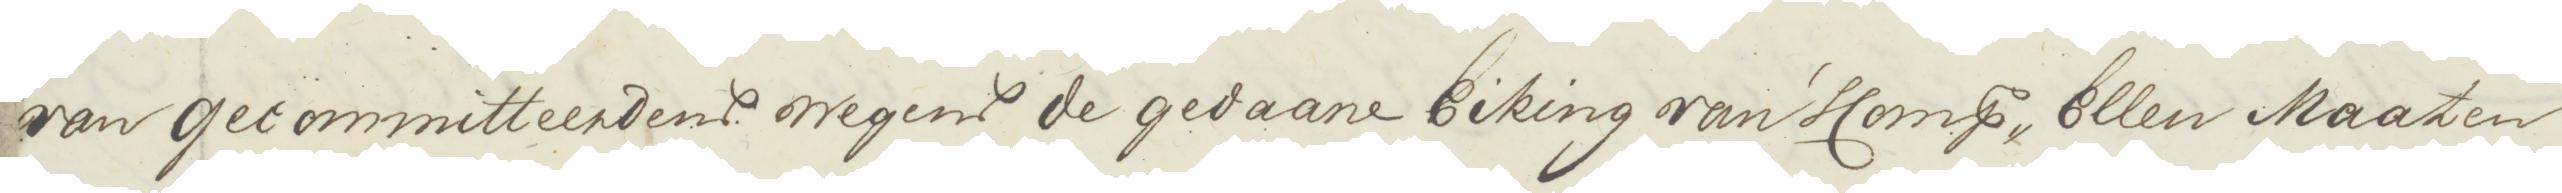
van gecommitteerdens wegens de gedaane Eiking van ’sComp„s Ellen Maaten
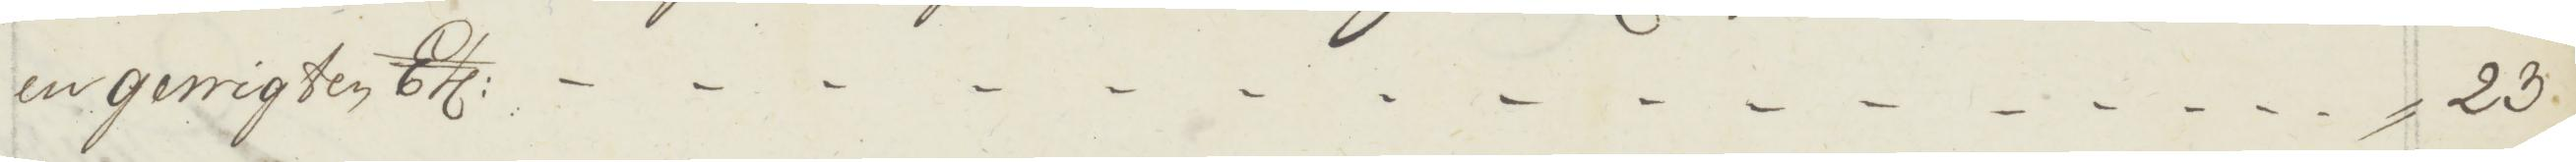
en gewigten Etc: - - - - - - - - - - - - - - - - „ 23
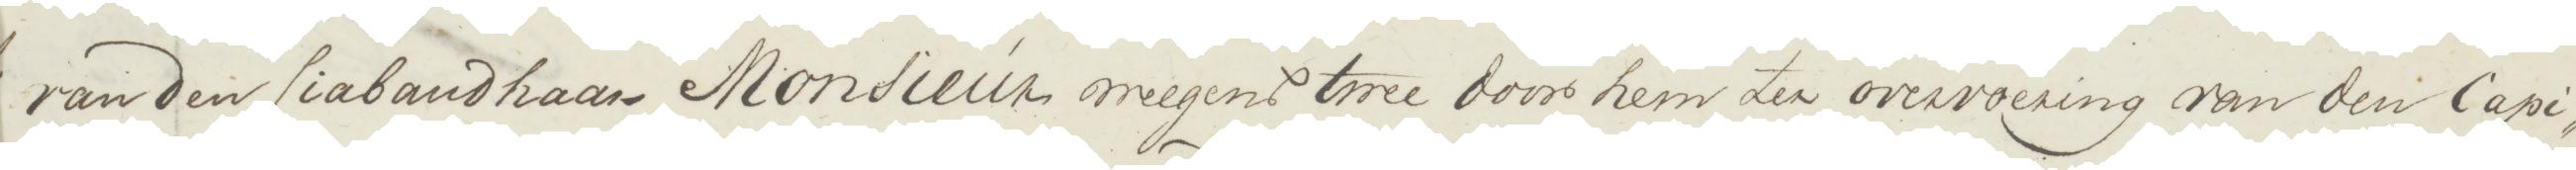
van den siaband haar Monsieur weegens twee door hem ter overvoering van den Capi
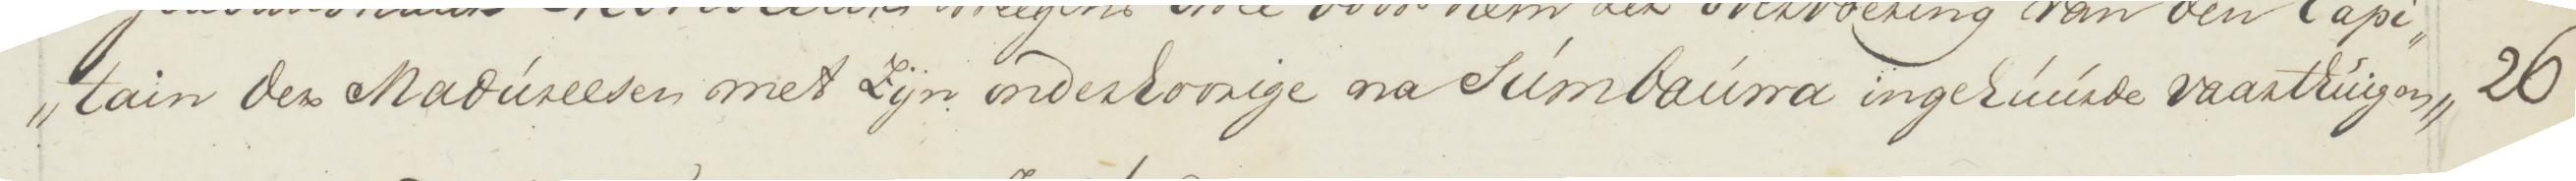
„tain der Madureesen met zijn onderhoorige na Sumbauwa ingehuurde vaarthuigen„ 26
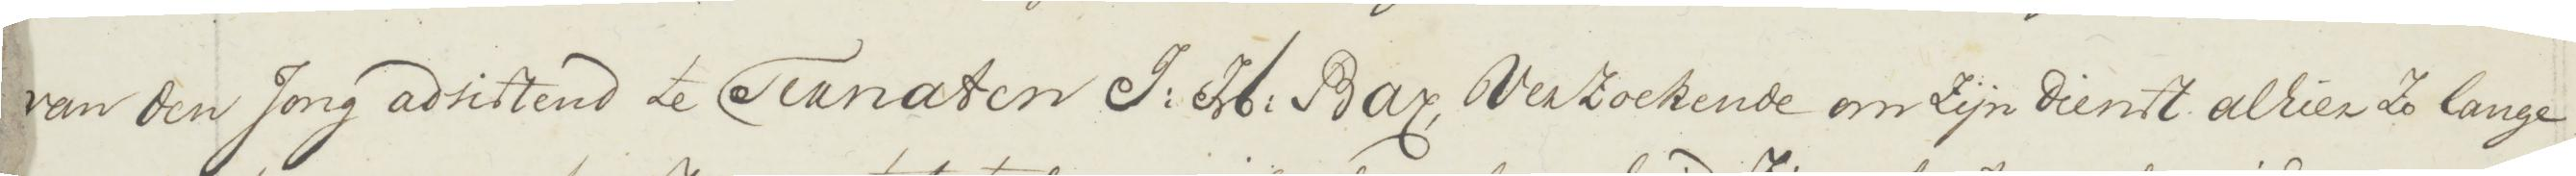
van den Jong adsistend te Ternaten I: H: Bax, verzoekende om zijn dienst alhier zo lange
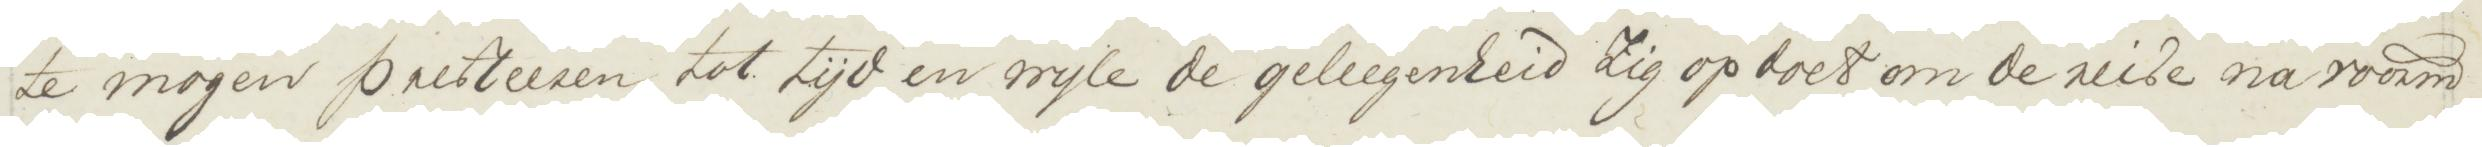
te mogen presteeren, tot tijd en wijle de geleegenheid zig op doet om de reise na voorm
